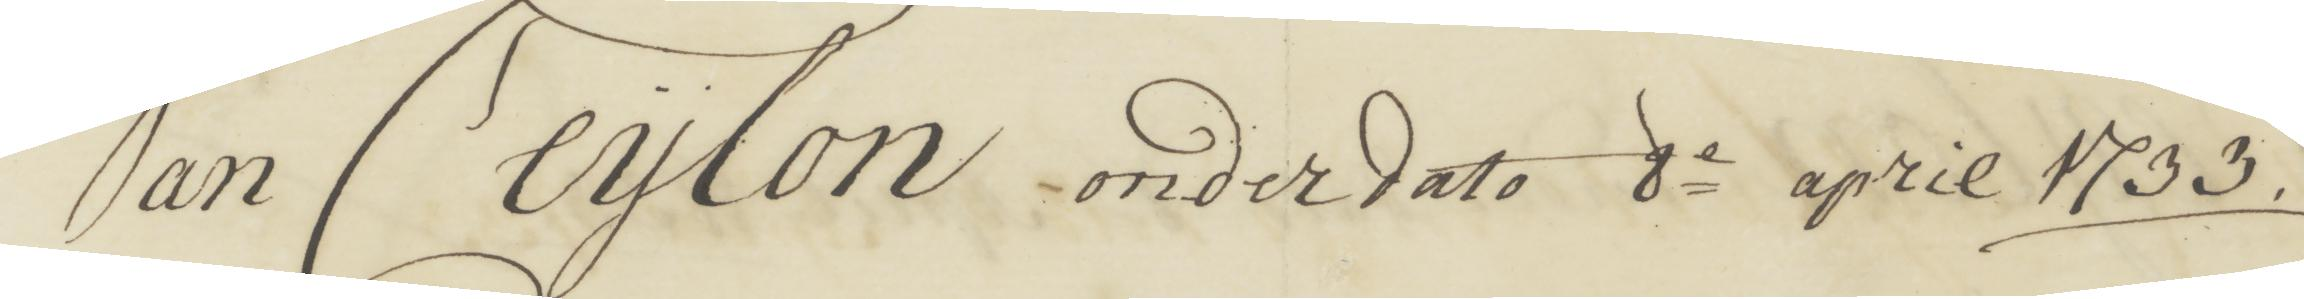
Van Ceijlon onder dato 8=e april 1733.
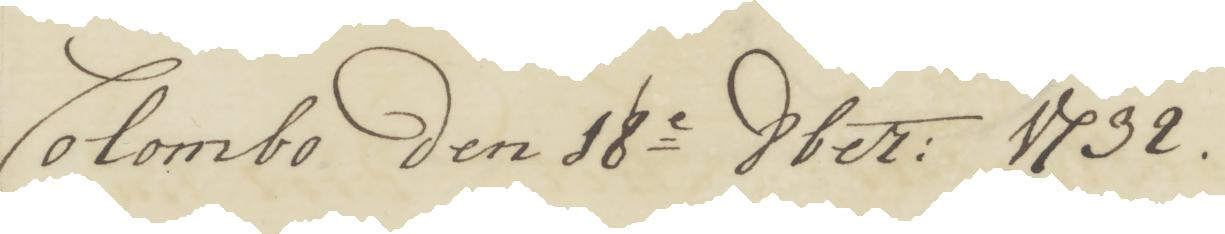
Colombo den 18=e 8ber: 1732.
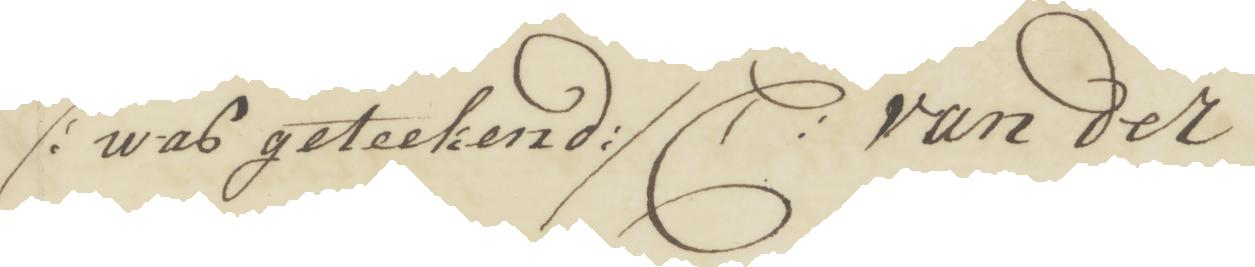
/: was geteekend:/ C: van der
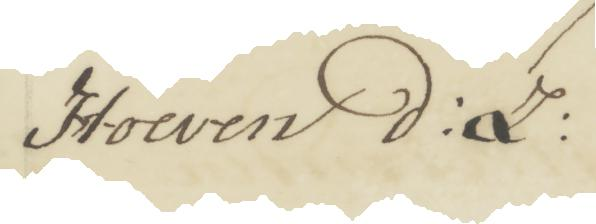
Hoeven d: Z:
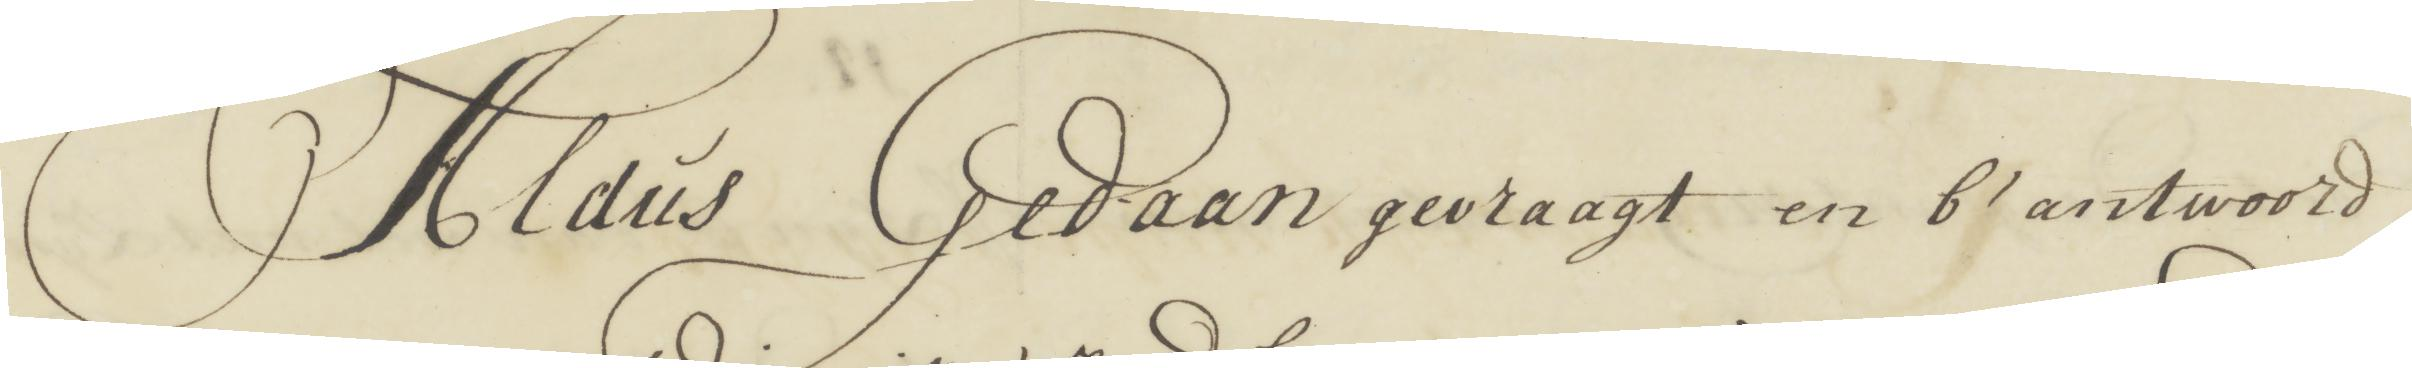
Aldus Gedaan gevraagt en b' antwoord,
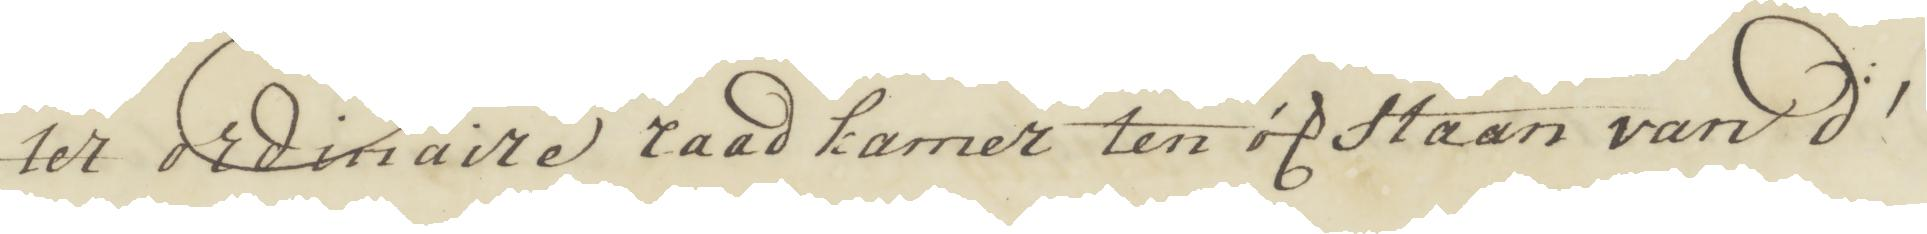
ter ordinaire raad kamer ten overstaan van d:'
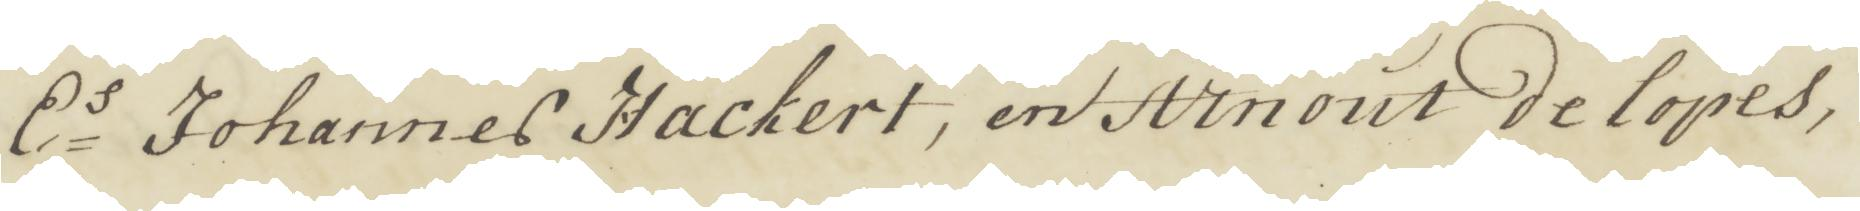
E=s Iohannes Hackert, en Arnout de lopes,
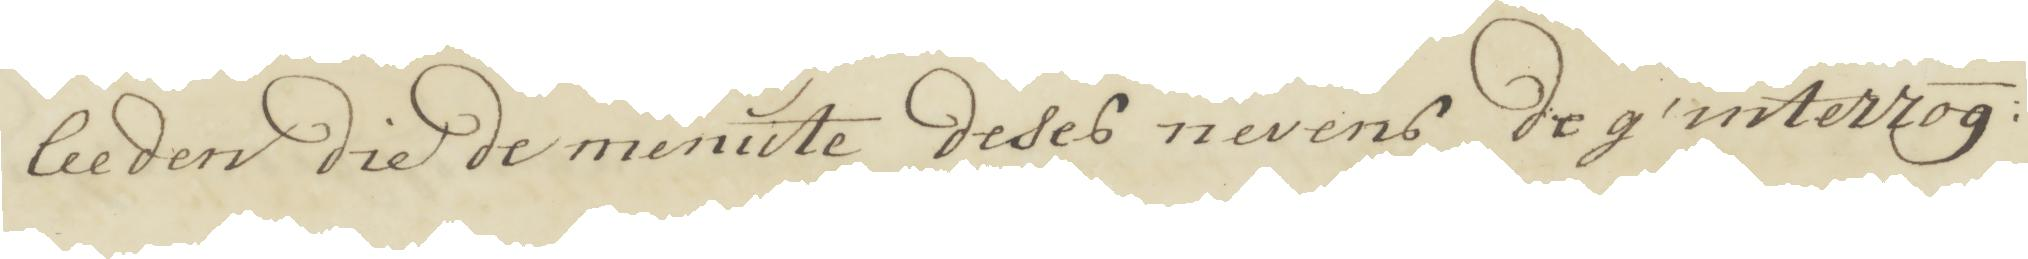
leeden die de minute deses nevens de g’interrog:
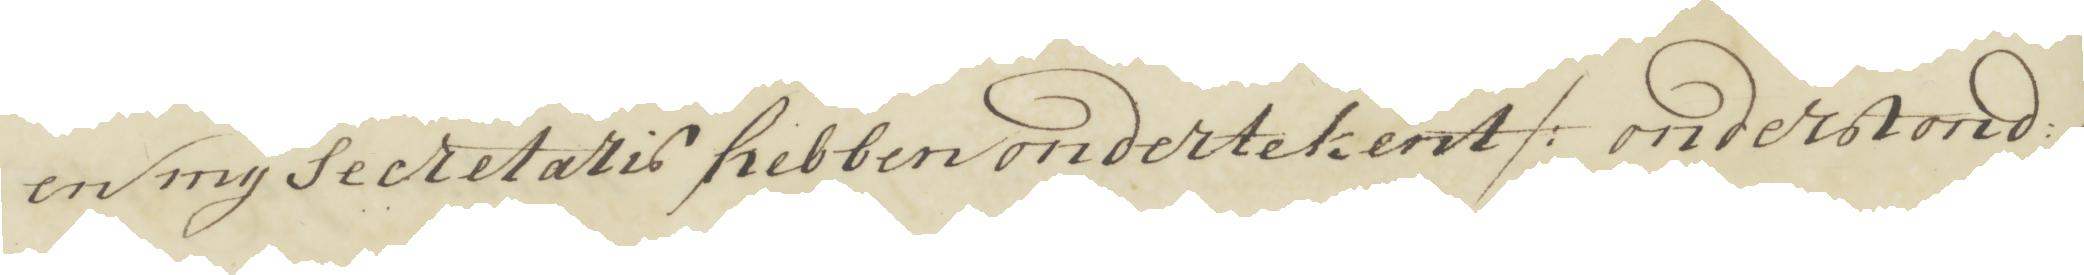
en mij secretaris hebben ondertekent /: onderstond:/
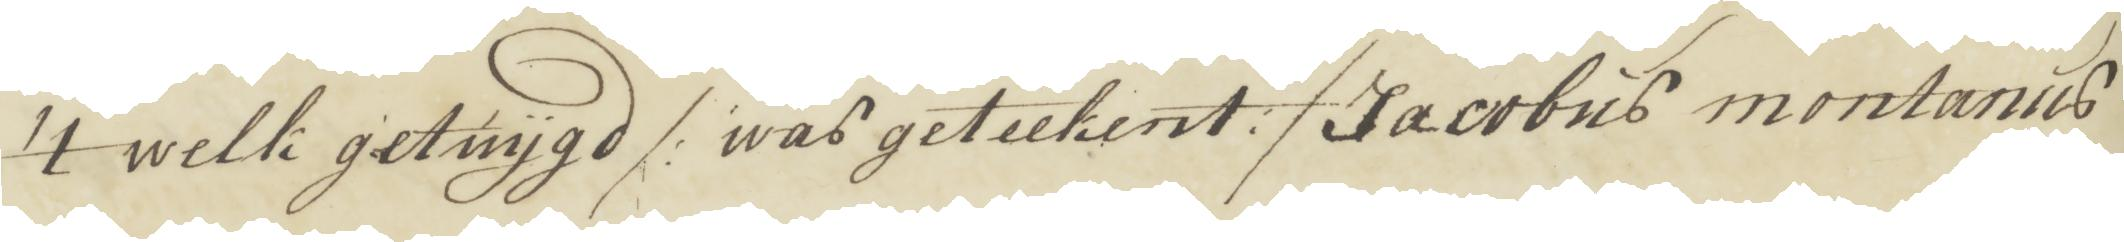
’t welk getuijgd /: was geteekent :/ Iacobus montanus
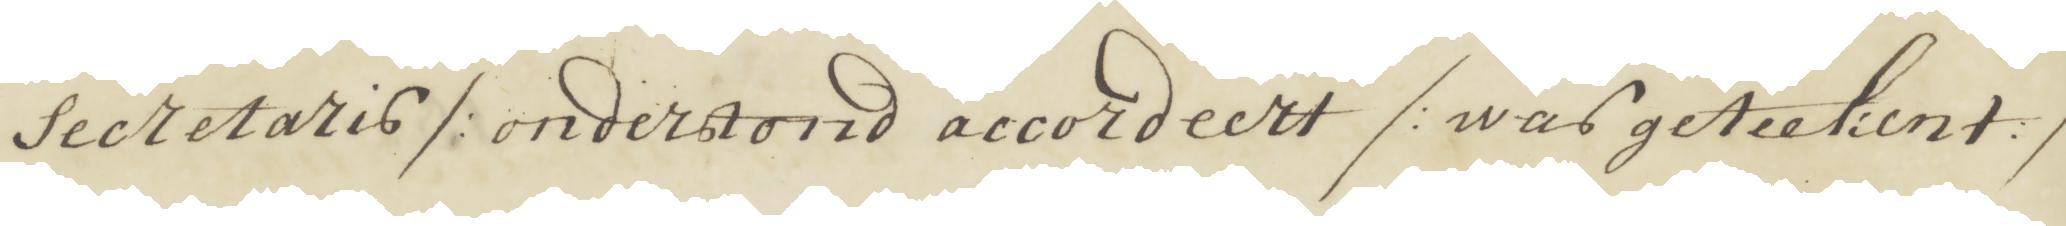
secretaris /: onderstond accordeert /: was geteekent:/
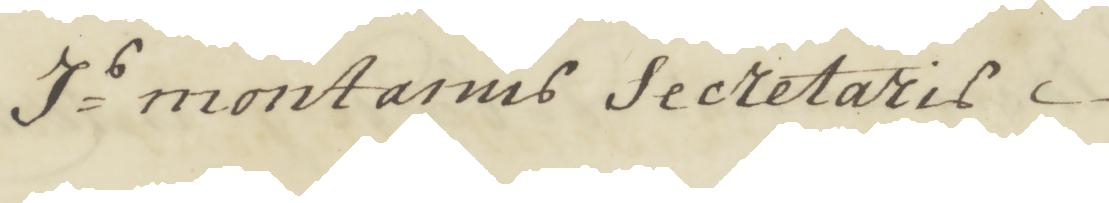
I=s montanus Secretaris ~
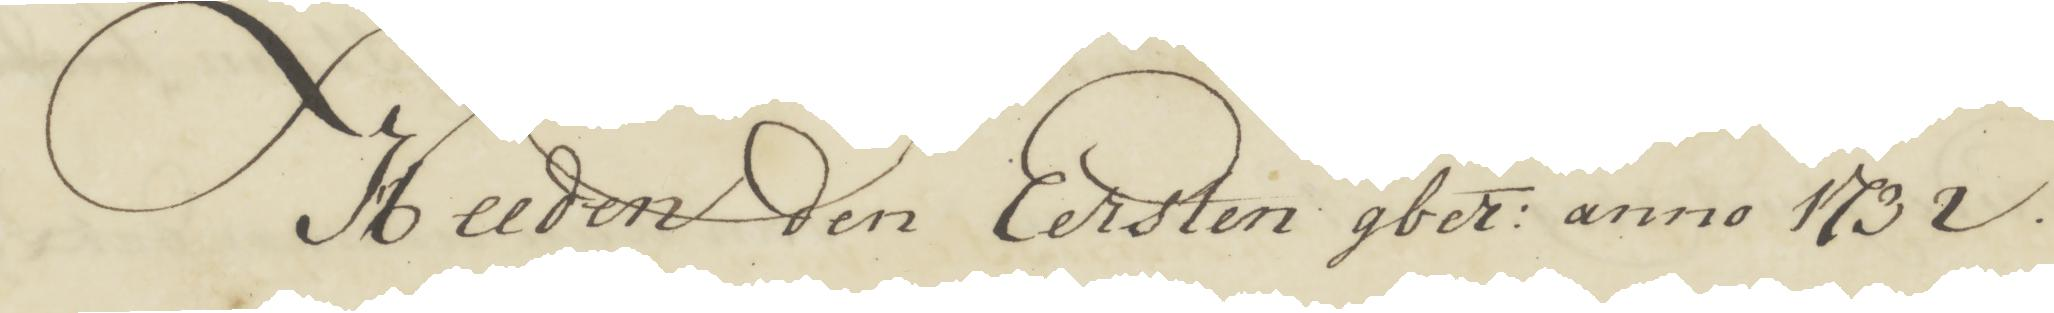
Heeden den Eersten gber: anno 1732.
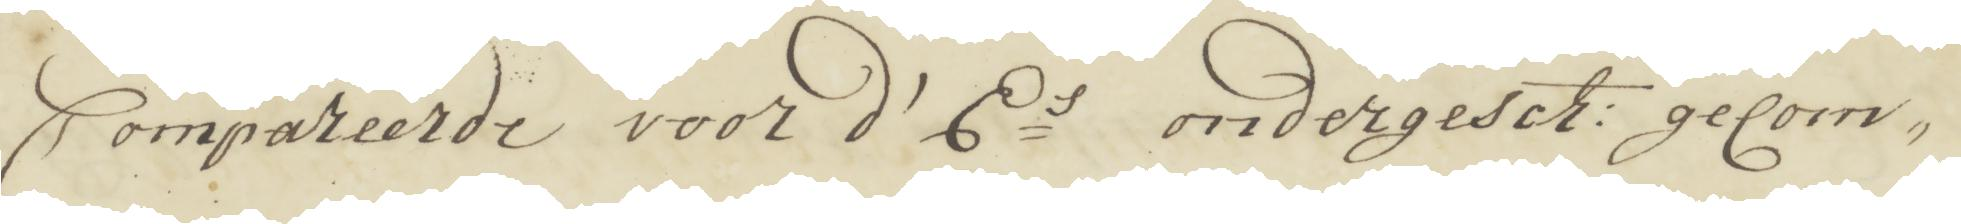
Compareerde voor d’ E=s ondergesch: gecom„
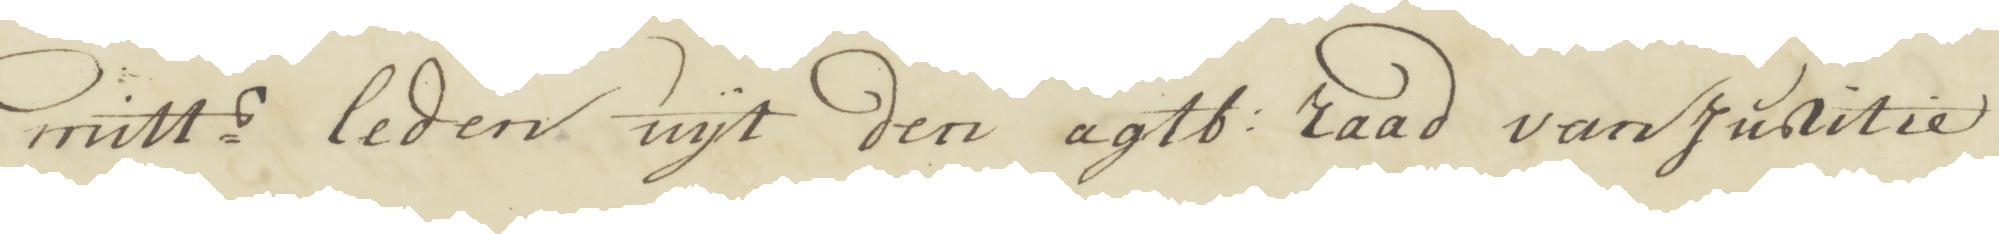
mitt=s leden uijt den agtb: raad van Justitie
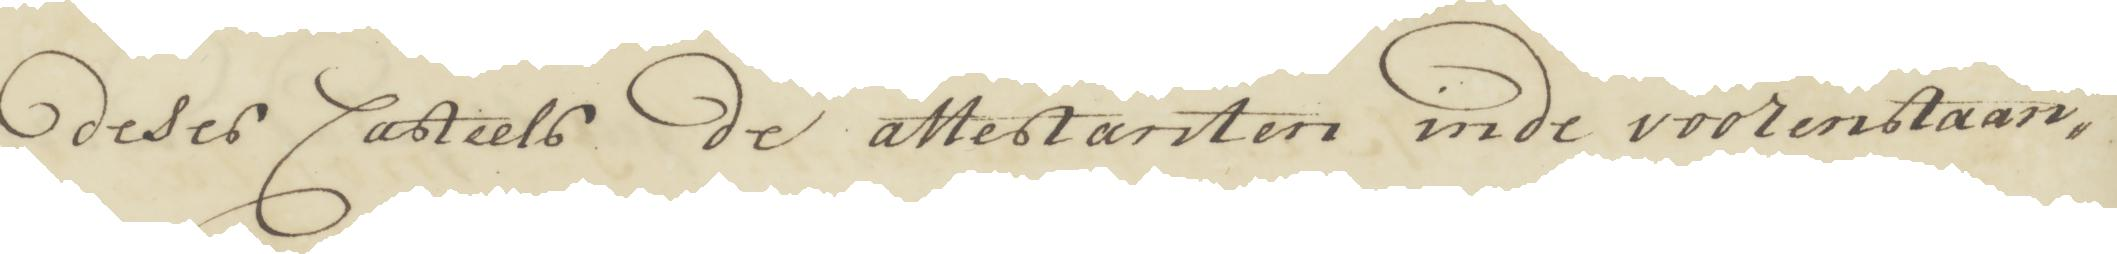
deses Casteels de attestanten inde voorenstaan„
